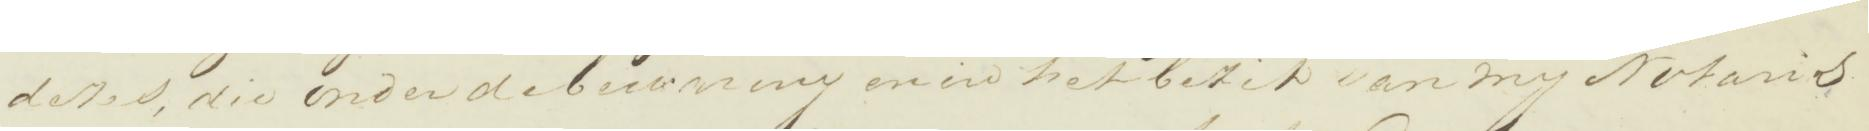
dezes, die onder de bewaring en in het bezit van mij Notaris.
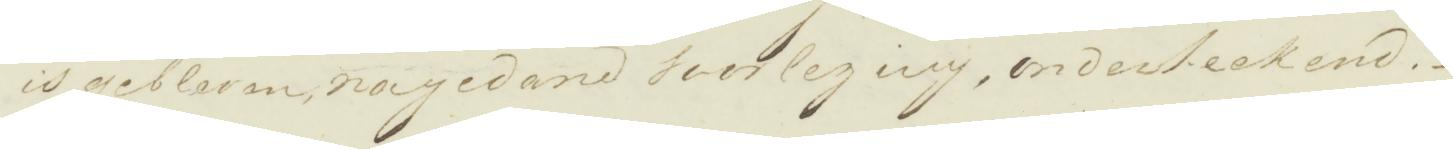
is gebleven, na gedane voorlezing, onderteekend.-
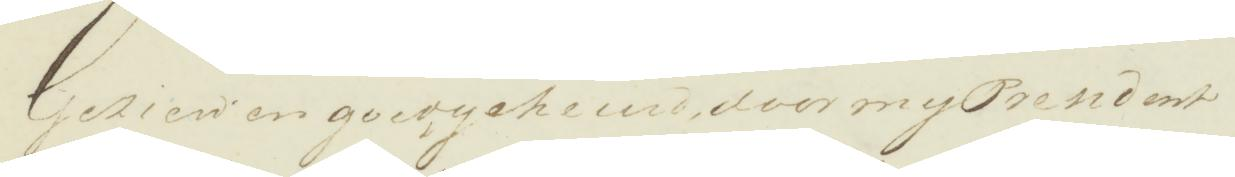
Gezien en goedgekeurd, door my President
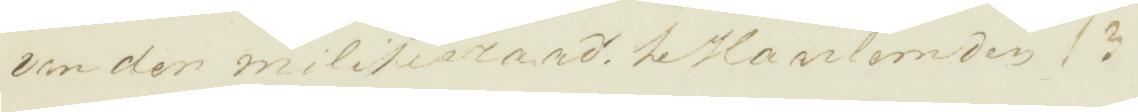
van den militieraad, te Haarlem den 13
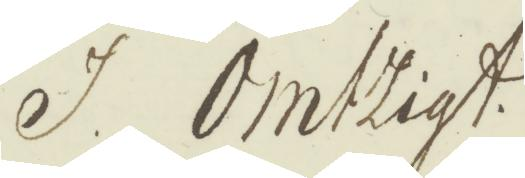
J. Omtzigt.
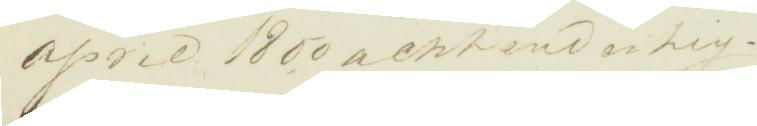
april 1800 acht endertig
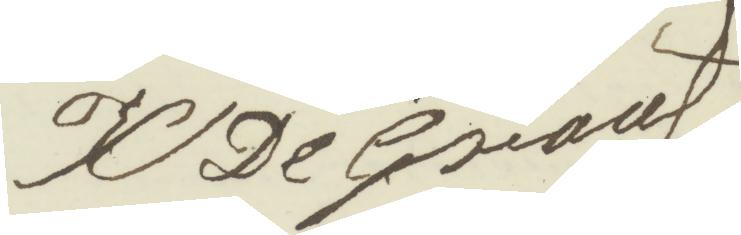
JC De Graaf
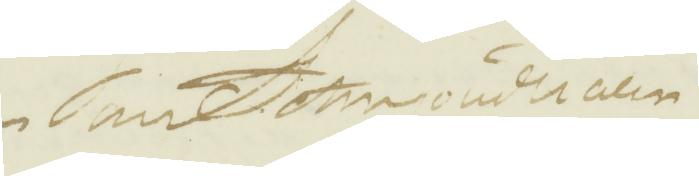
Van Tetsvgoudriaan
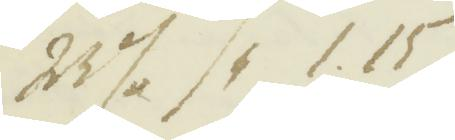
23% „ 1.15
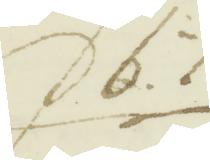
ƒ 6.15
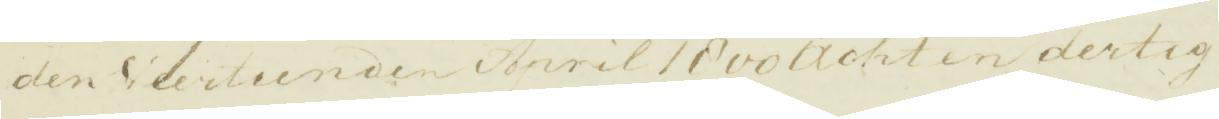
den Veertienden April 1800 Acht en dertig
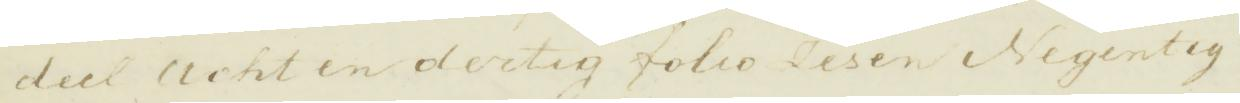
deel acht en dertig folio zesen Negentig
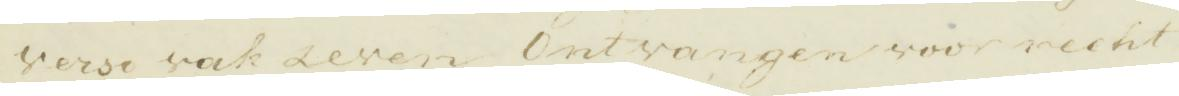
Verso vak zeven Ontvangen voor recht
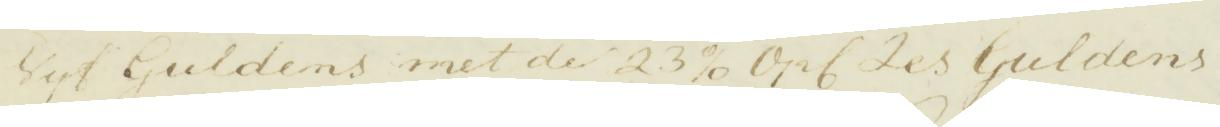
Vyf Guldens met de 23% OpC Zes Guldens
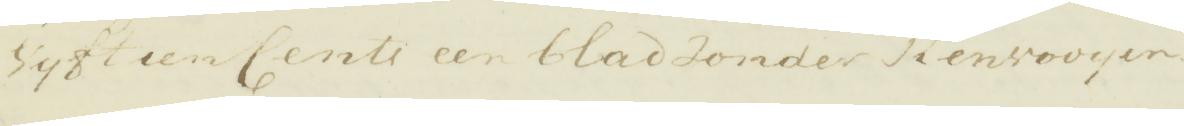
Vijftien Cents een blad zonder Renvooyen.
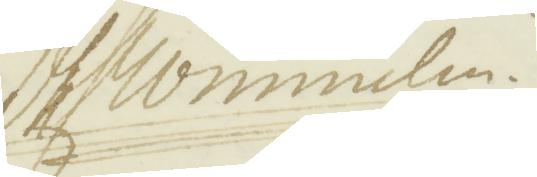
DFCommelin.
